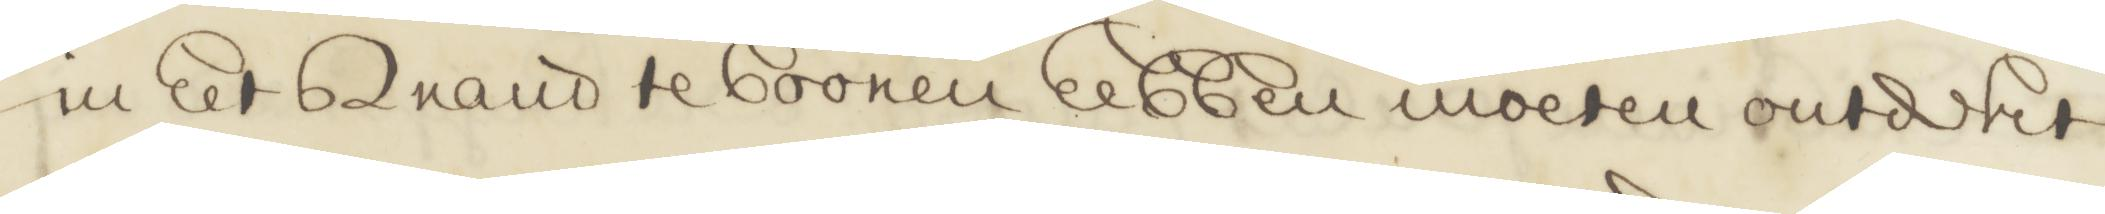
in het strand te booren hebben moeten ontdekt
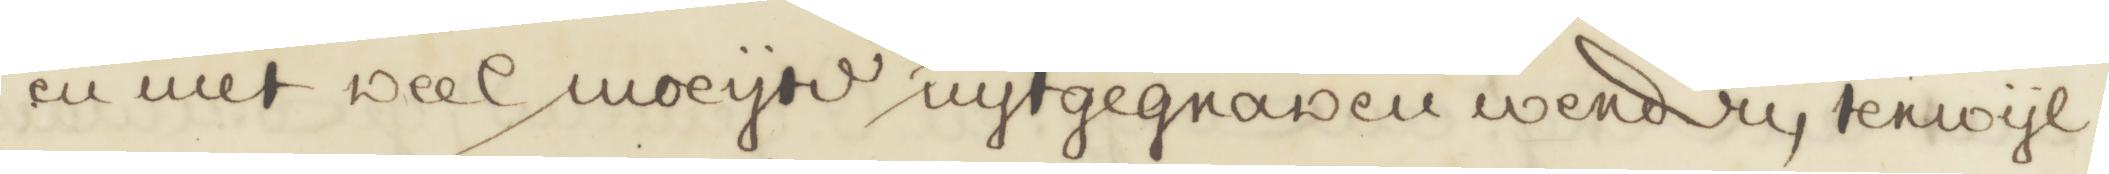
en met veel moeijte uijtgegraven werden, terwijl
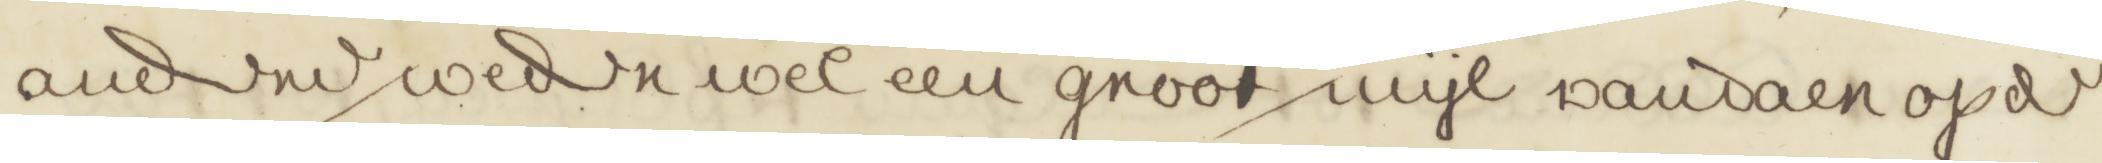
andere weder wel een groot mijl vandaer op de
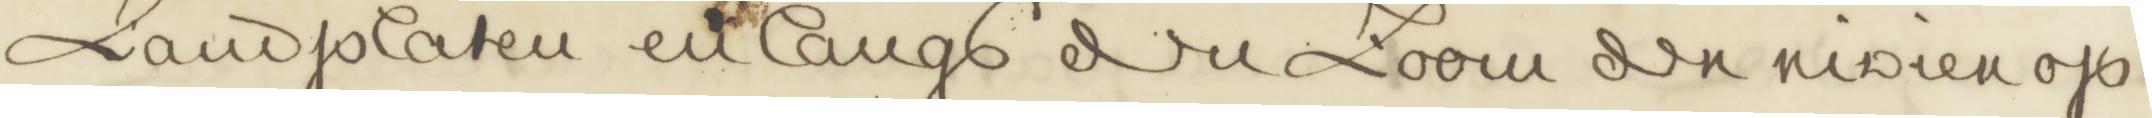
zandplaten en langs den zoom der rivier op
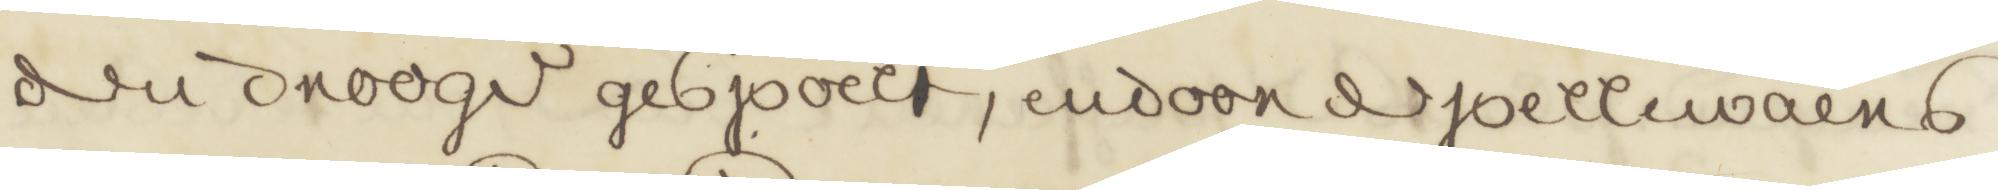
den drooge gespoelt, en door de pellewaers
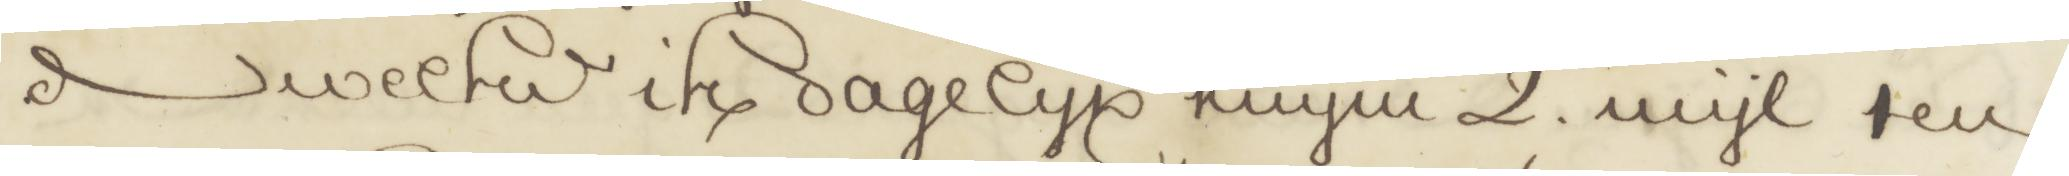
de welke ik dagelijx ruijm 2. mijl ten
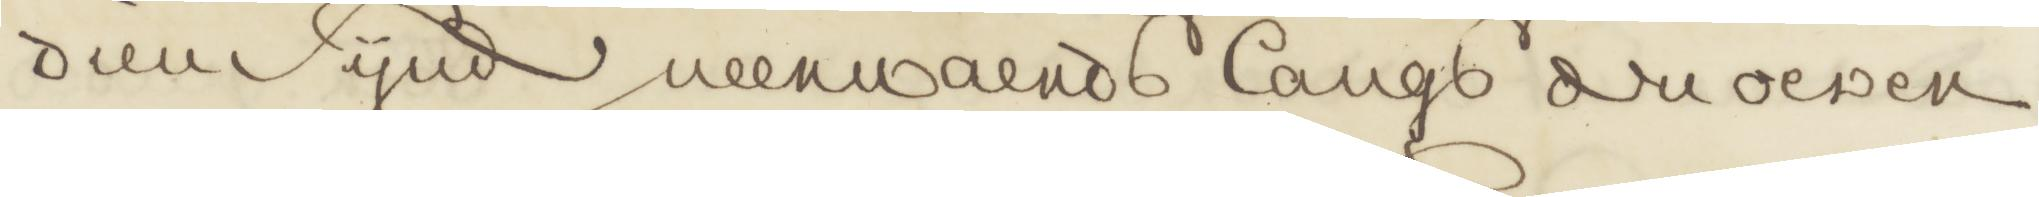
dien Eijnde neerwaerds langs den oever
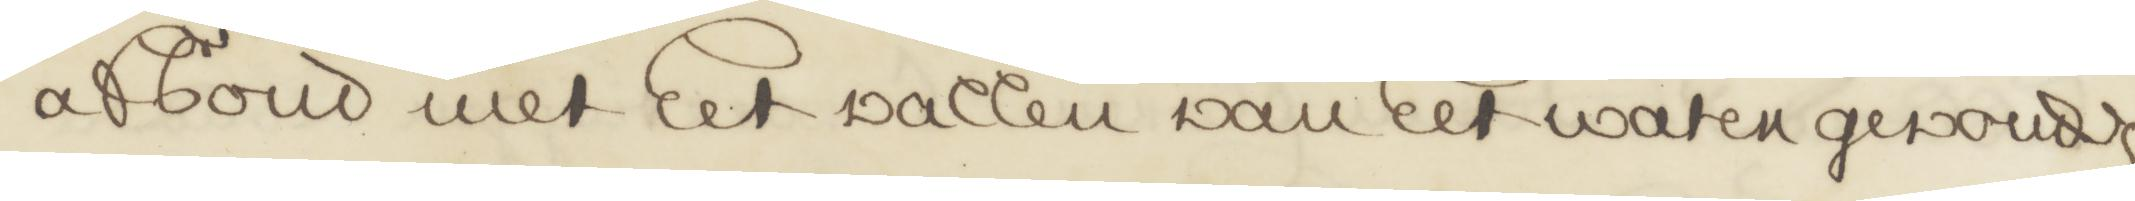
afsond met het vallen van het water gevonden
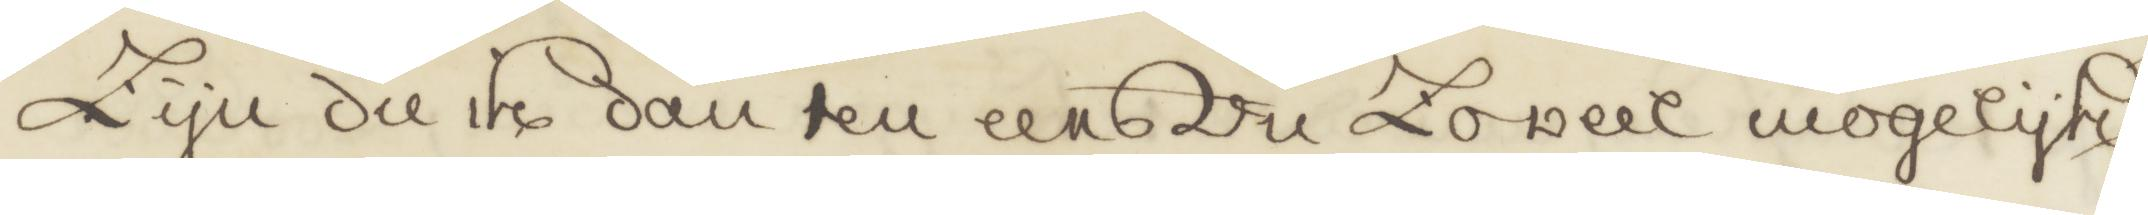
zijn die ik dan ten eersten zoveel mogelijk
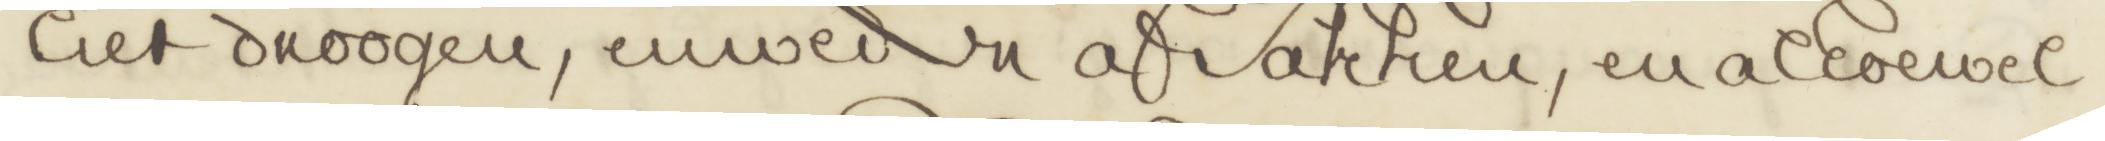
liet droogen, en weder afsakken, en alhoewel
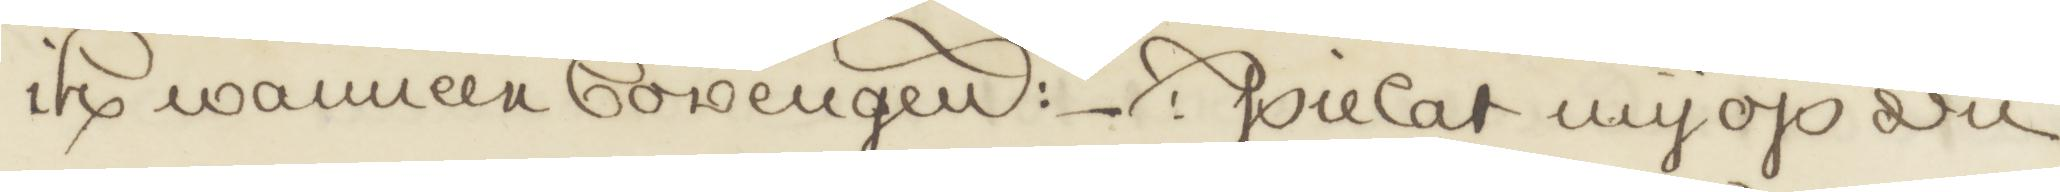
ik wanneer bovengen: E: pielat mij op den
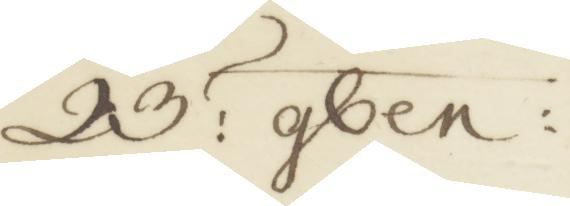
23:' 9ber:
